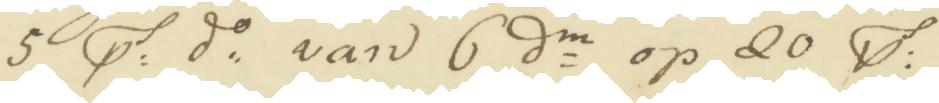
5 p:s d:o van 6 d=m op 20 p:s
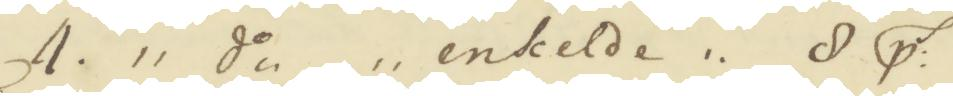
4. „ do „ enkelde „. 8 p„s
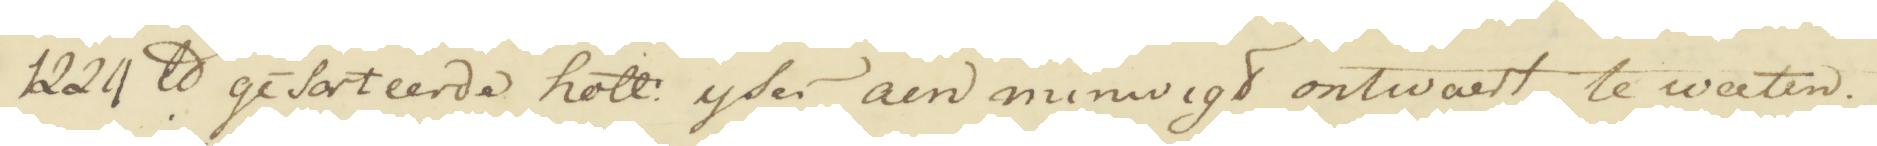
1224 lb gesorteerde holl: yser aen minwigt ontwaert te weeten.
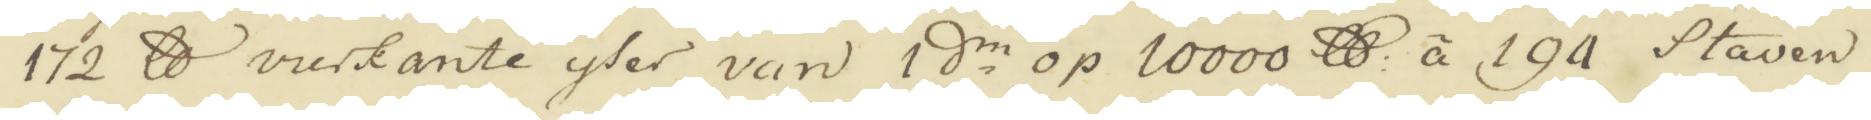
172 lb vierkante yser van 1 d„m op 10000 lb: â 194 Staven
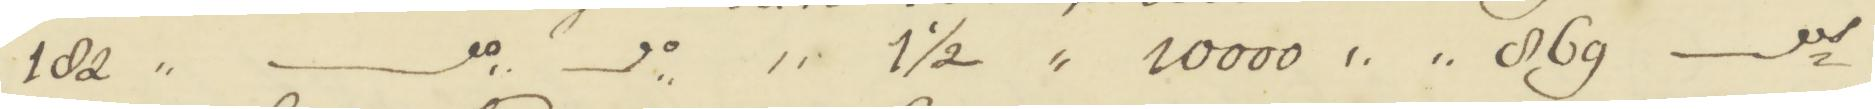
182 „ d.o. d„o „ 1½ „ 10000 „ „ 869 d=os
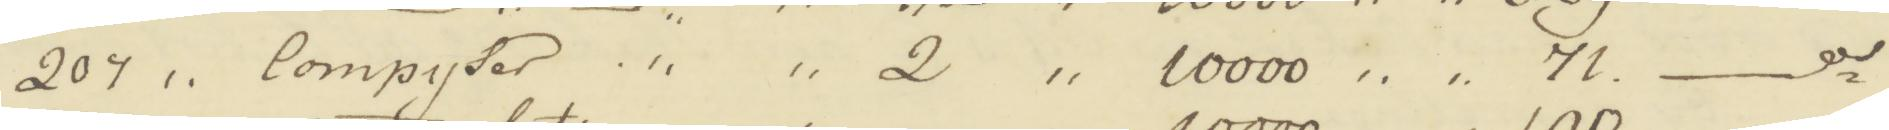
207 „. Compyser .„ „ 2 „ 10000 „. „. 71. d=os
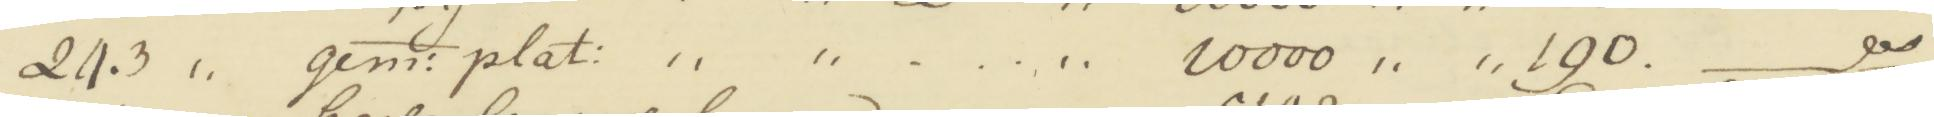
243 „. gem: plat: „ „ ... „10000 „ „ 190. d=os
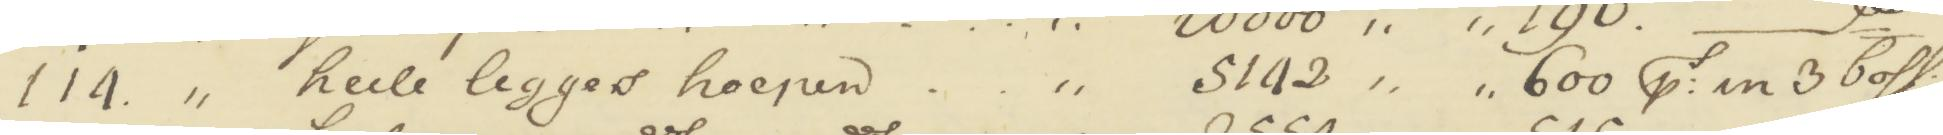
114. „ heele leggers hoepen . . „ 5142 „ „ 600 p:s in 3 boss:
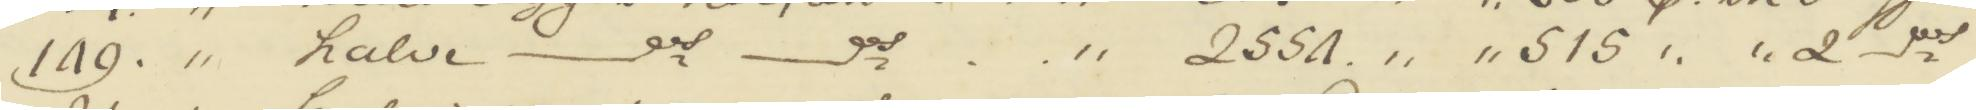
149. „ halve d„o d_os . . „ 2554. „ „ 515 „ „ 2 d=os
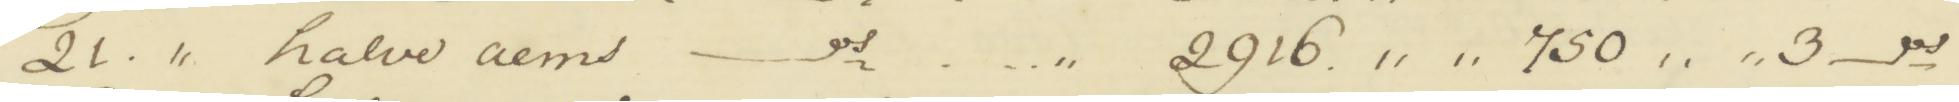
21. „ halve aems d=os . . . „ 2916. „ „ 750 „ „ 3 d=os
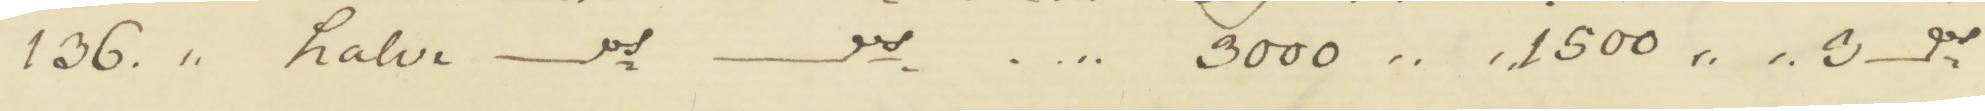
136. „ halve d=os d=os. . . „ 3000 „ „ 1500 „ „ 3 d=os
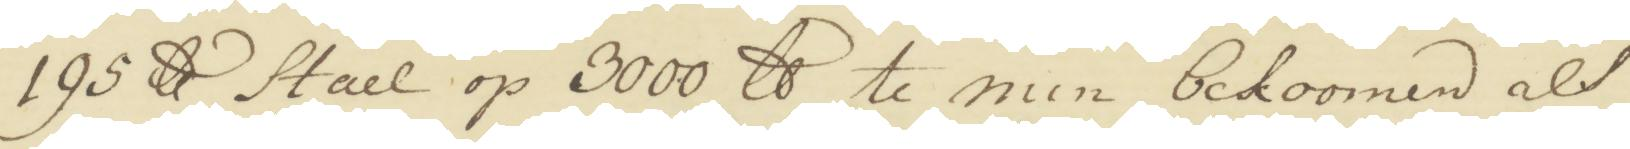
195 lb Stael op 3000 lb te min bekoomen als
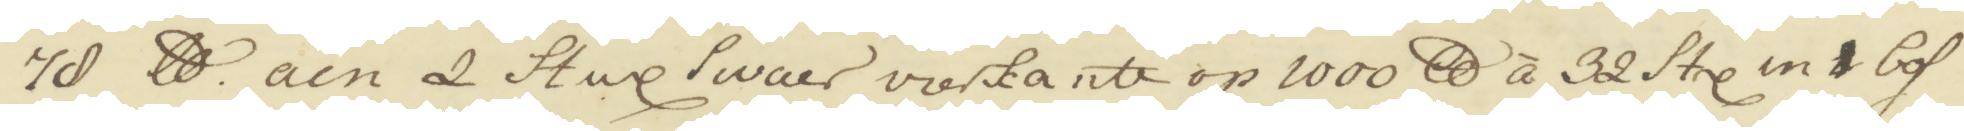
78 lb. aen 2 Stux Swaer vierkante op 1000 lb à 32stx in 1 bos
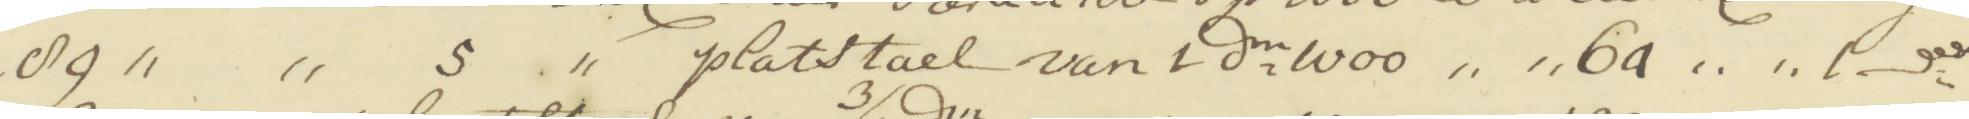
89 „ „ 5 „ platstael van 1 d=m 1000 „ „ 64 „ „. 1 d„o
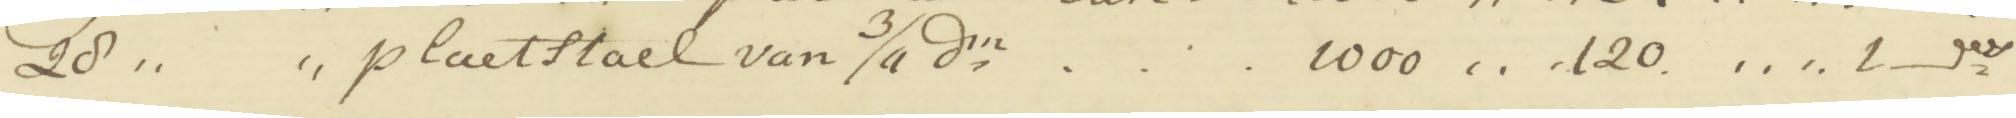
28 „ „ plaetstael van ¾ d„m . . . 1000 „ „120 „ „ 1 d=o
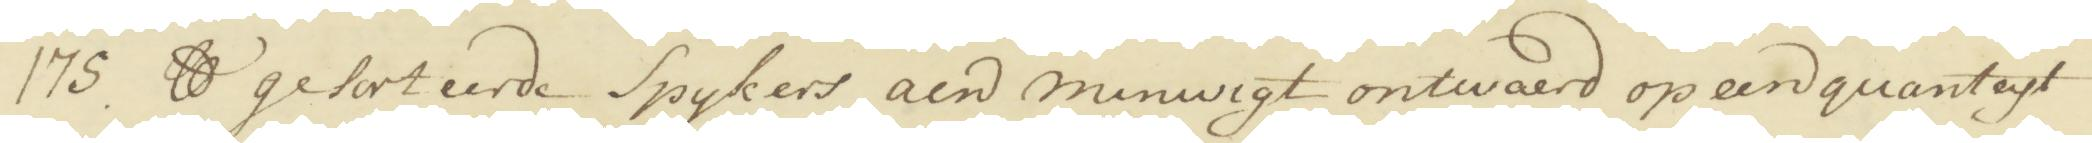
175. lb gesorteerde Spykers aen minwigt ontwaerd op een quanteyt
